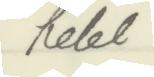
ketel
